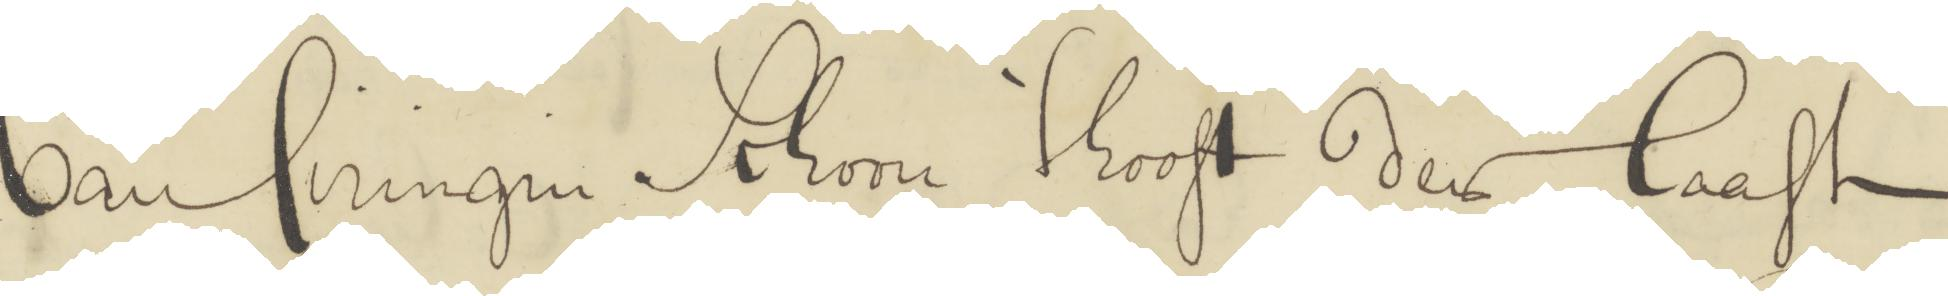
van siringin schoon ’t hooft der laast
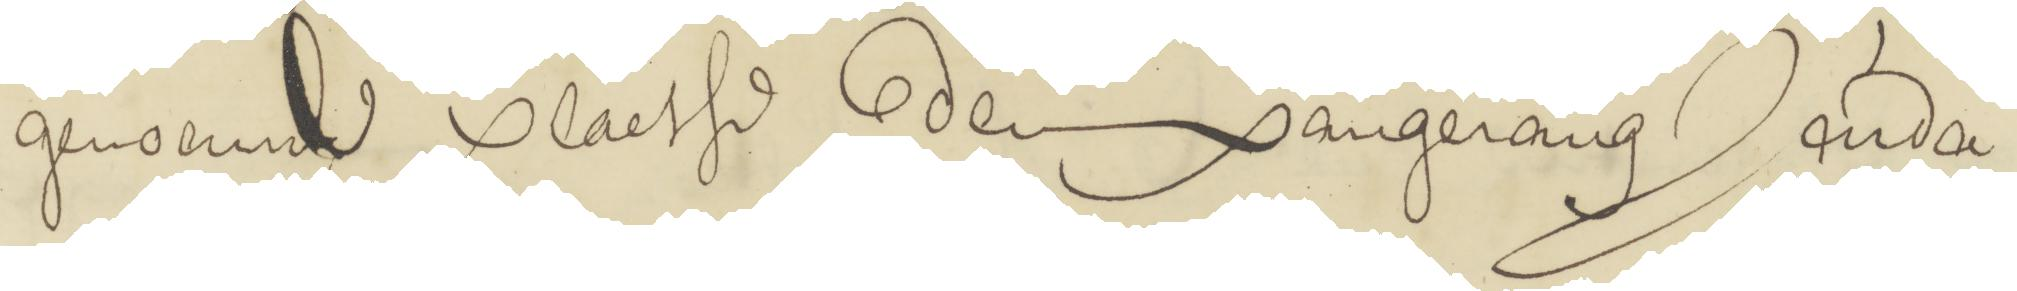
genoemde plaetse den pangerang Jnda
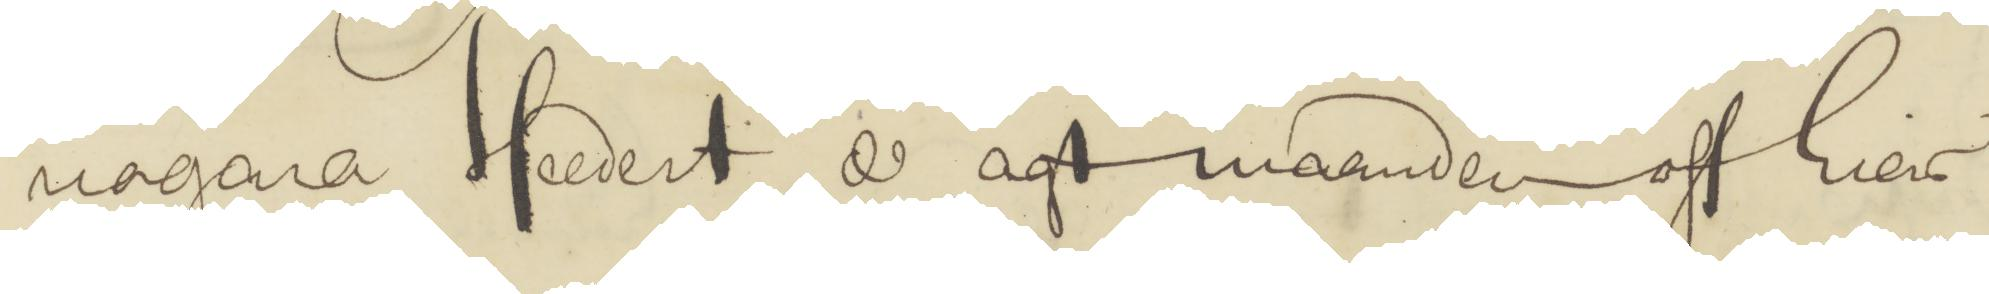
nagara tseedert de agt maanden off hier
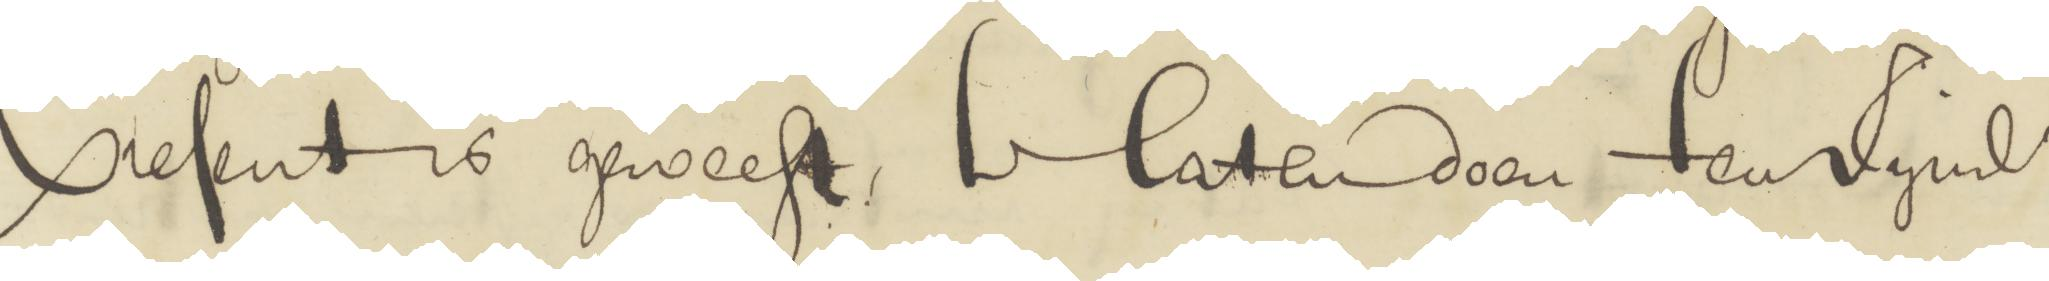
present is geweest, te laten doen ten Eijnde
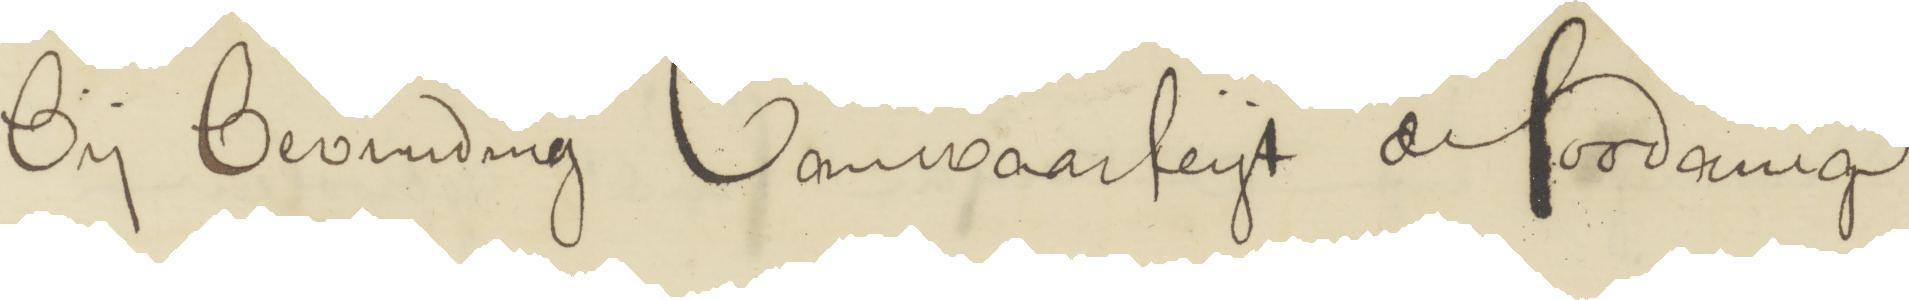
bij bevinding vanwaarheijt de soodanige
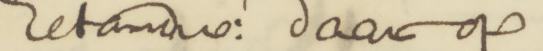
het andw: daar op
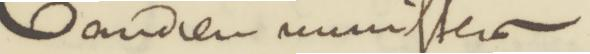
vandien minister
